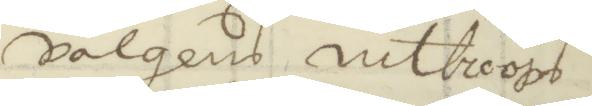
volgens uitkoops
